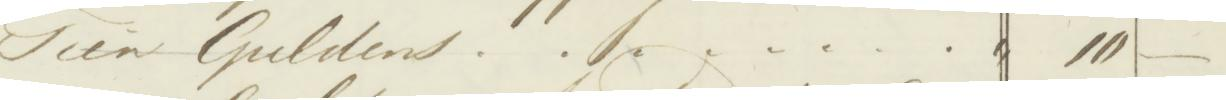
Tien Guldens . . . . . . . . „ 10 —
